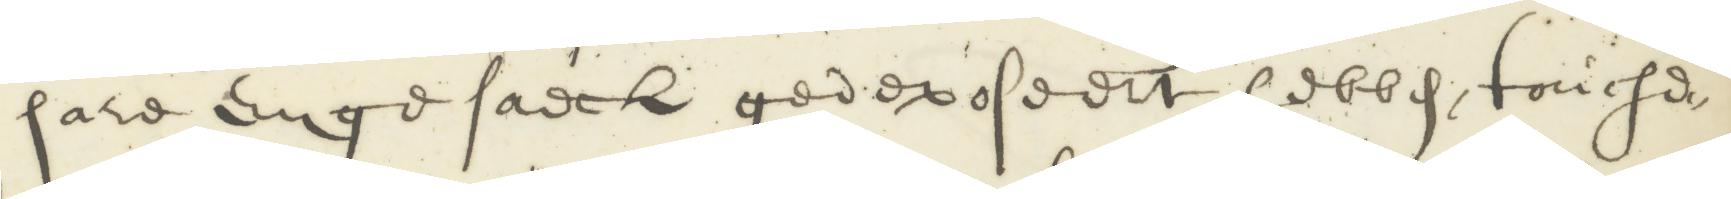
hare Eyge saeck gedeposeert hebben, touche„
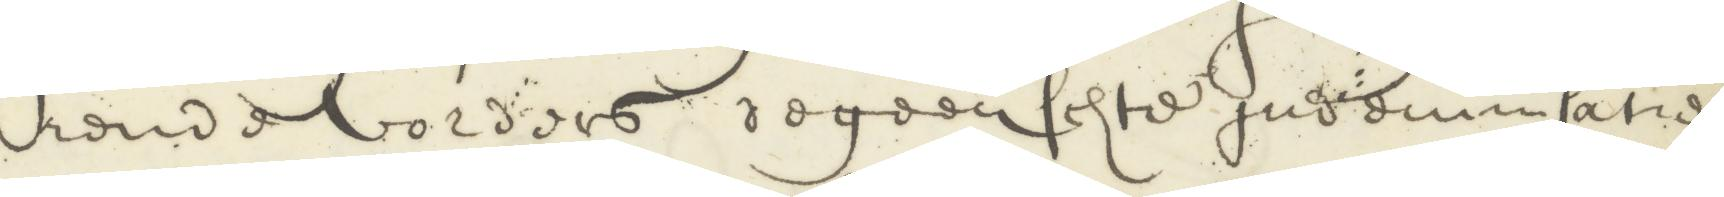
rende vorders dog degeeyschte Jndemnisatie
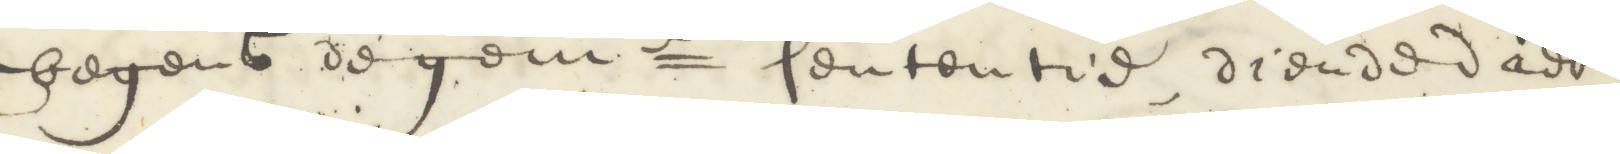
wegens de gem=e sententie diende daer
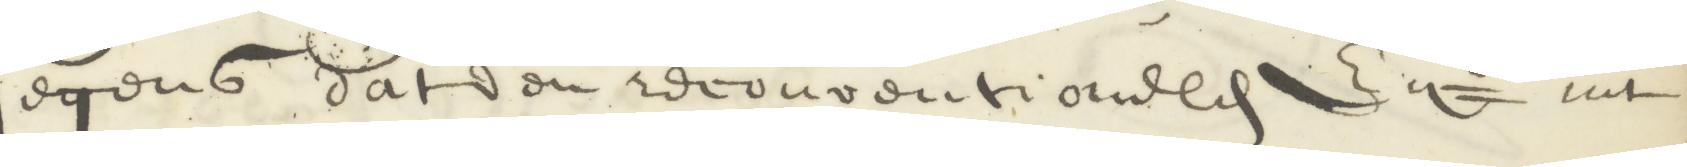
jegens datden reconventionelen Ey=r int
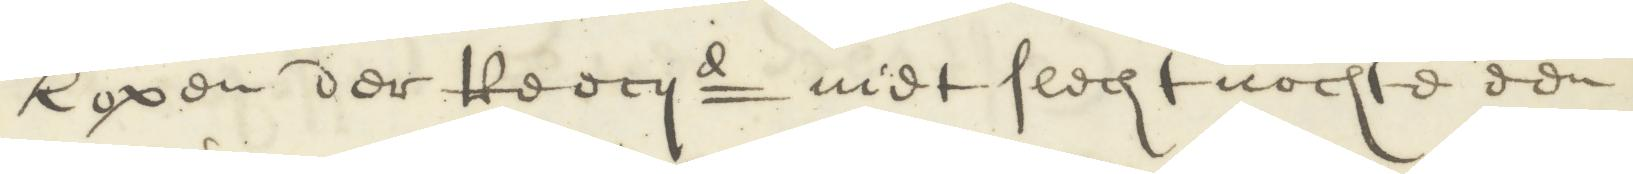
kopen der Reecq=en niet slecht noch te een
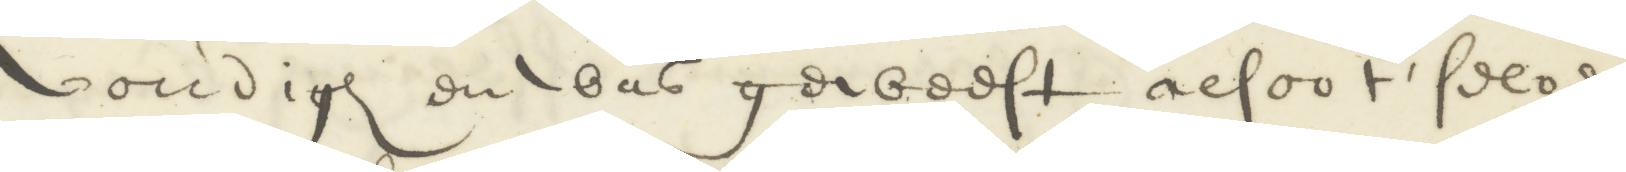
voudigh en was geweest alsoo t' selve
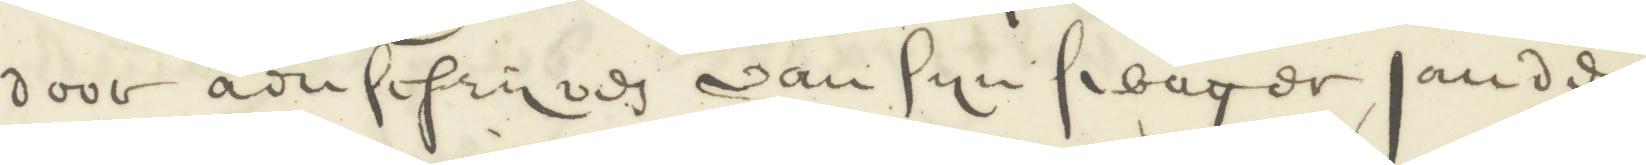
door aen schrijven van syn swager Jan de
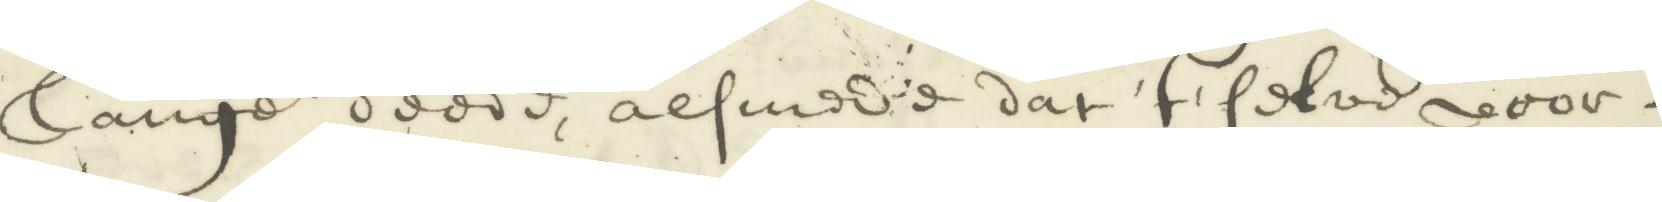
Lange deede, alsmede dat ’t selve voor
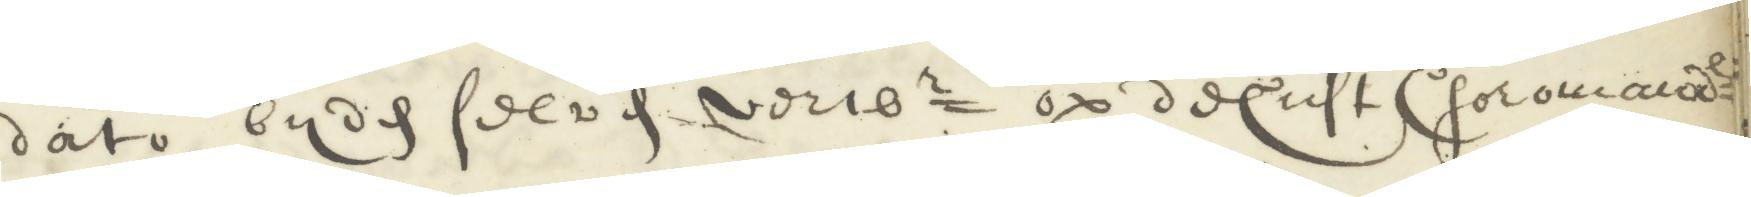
dato byden selven verw=r op de Cust Choromand=e
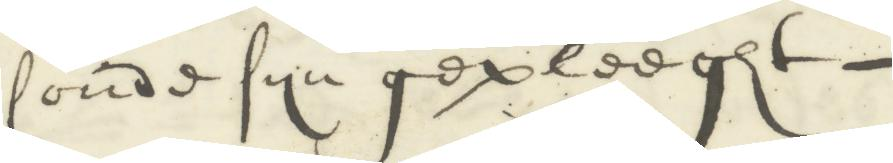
soude sijn gepleeght —
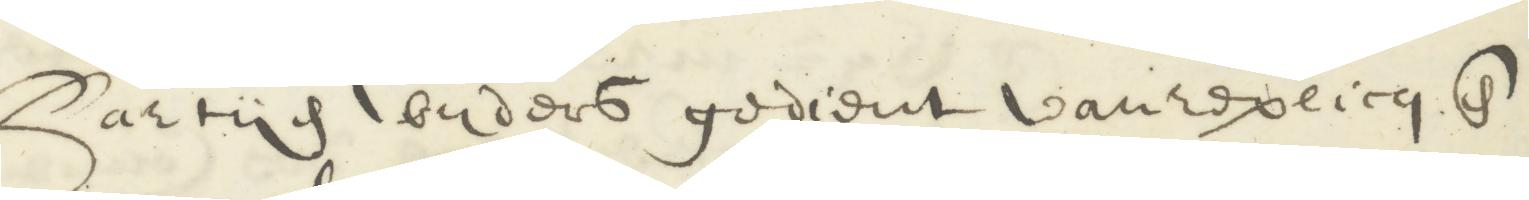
Partijen wijders gedient van replicq ende
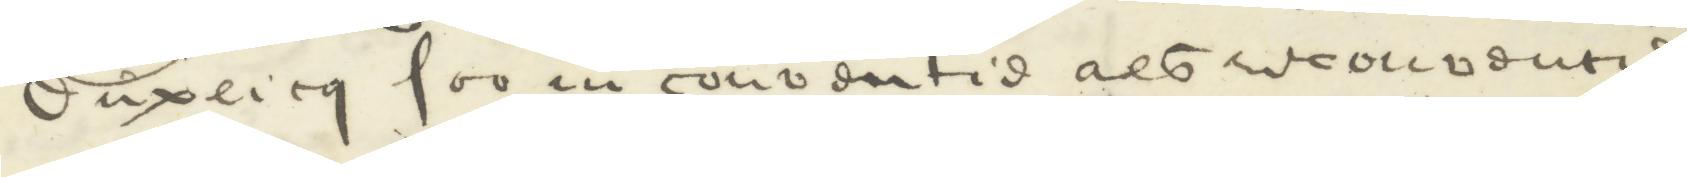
Duplicq soo in conventie als reconventie
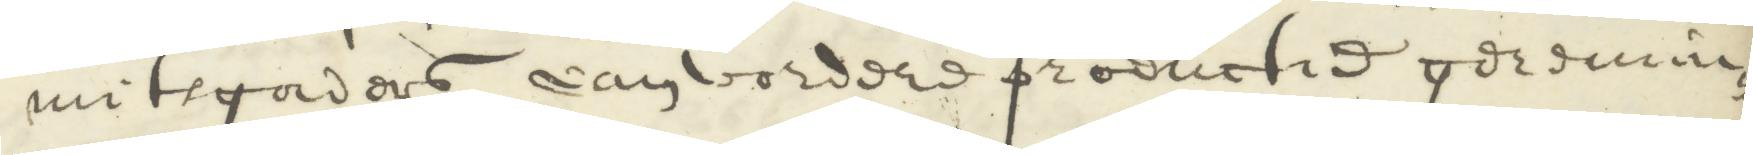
mitsgaders van vordere productie gerenun
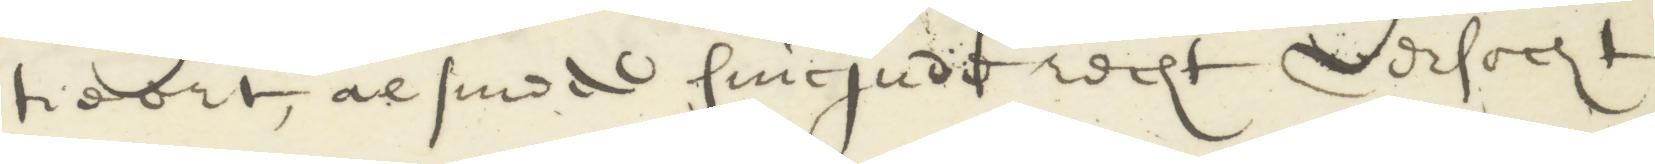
tieert, alsmede sulc jnde recht versocht
